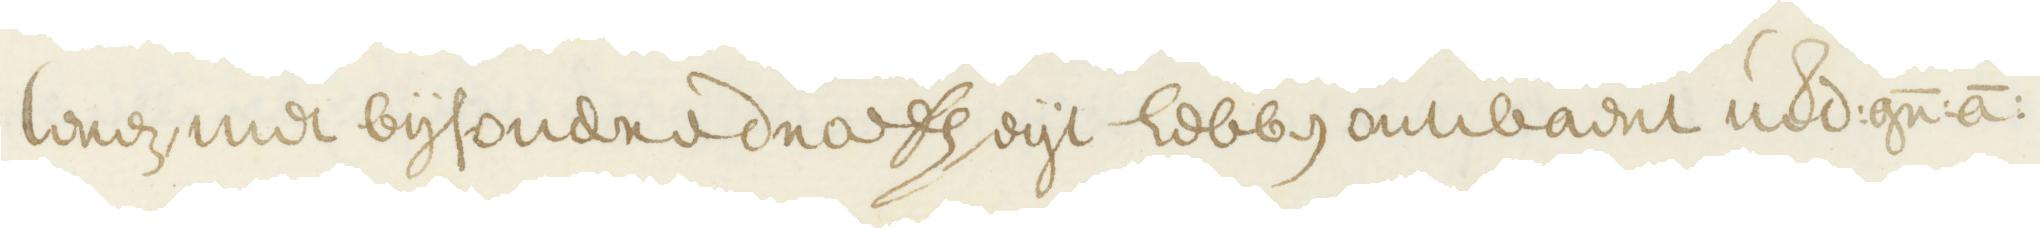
teren, met bijsondere droefheijt hebben ontwaert uEd: gr: a:
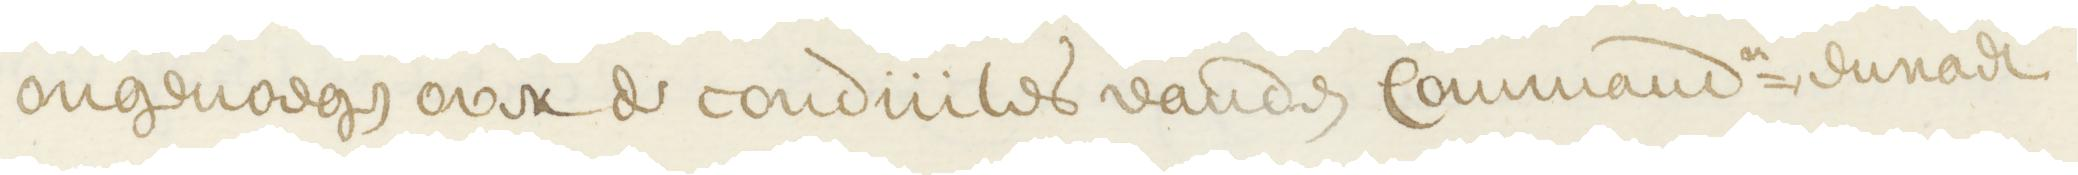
ongenoegen over de condiiites van den Command=r, en raet
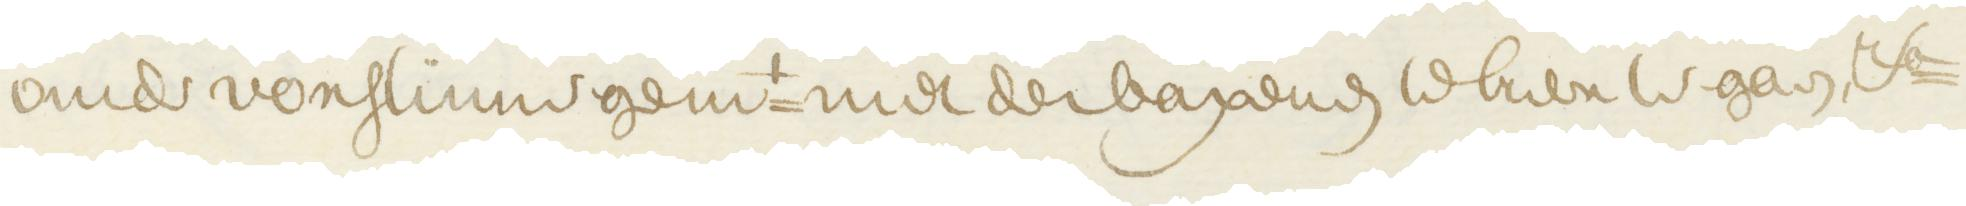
om de vorstinne gem=t met de wapenen te keer te gaen, &=a
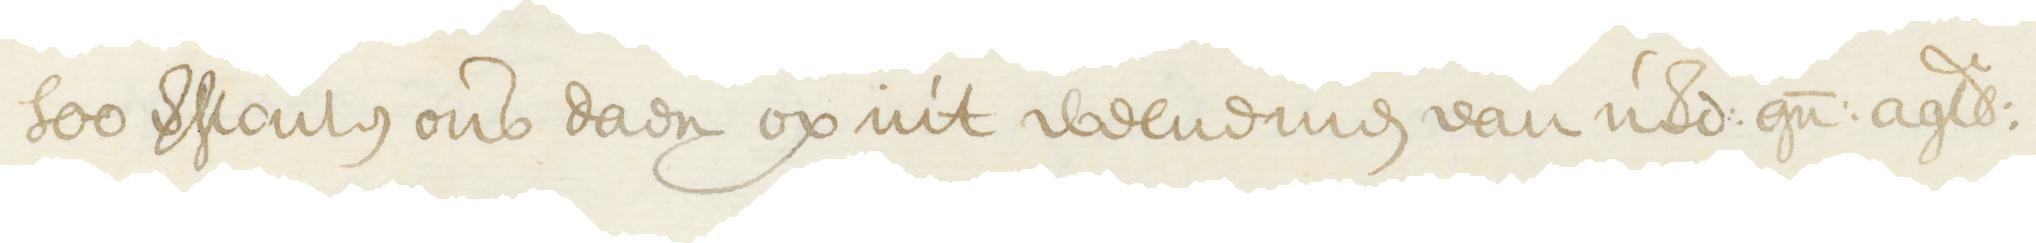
soo verstouten ons daer op in’t welnemen van uEd: gr: agtb:
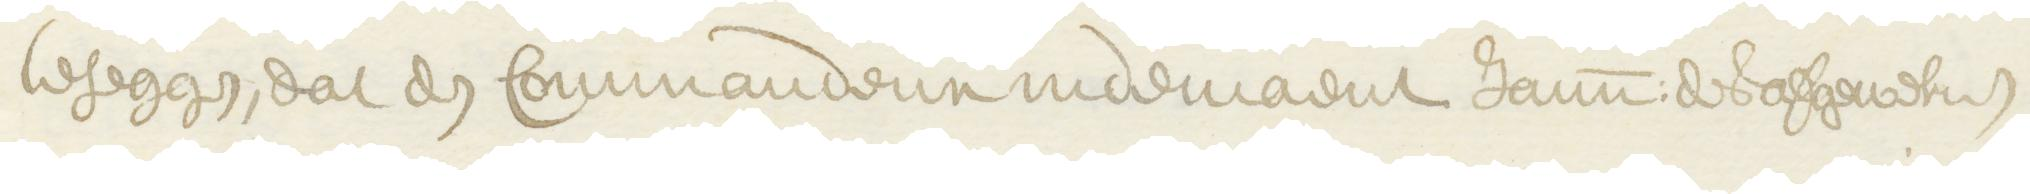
teseggen, dat den Commandeur in demaent Iann: des afgaweken
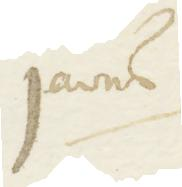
jaers
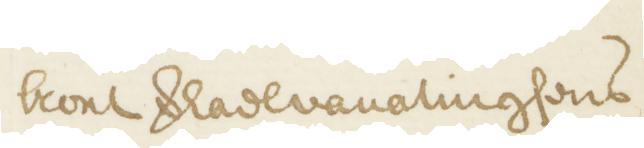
kort verhael van atingsens
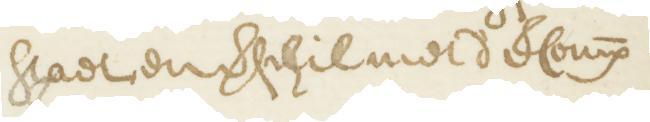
staet, en verschil met d’ EComp
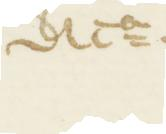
Etc=a
